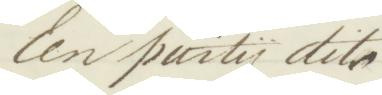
Een partij dito
